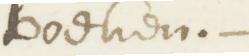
boeken.-
